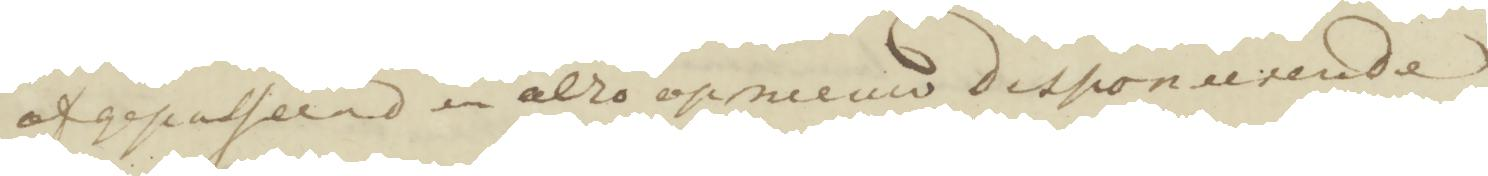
of gepasseerd en alzo opnieuw disponeerende
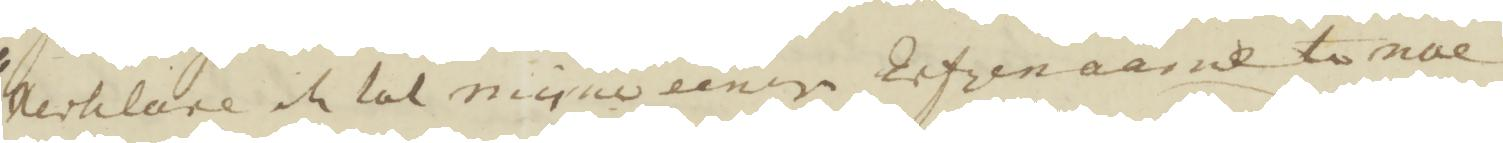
Verklare ik tot mijne eenige Erfgenaame te noe
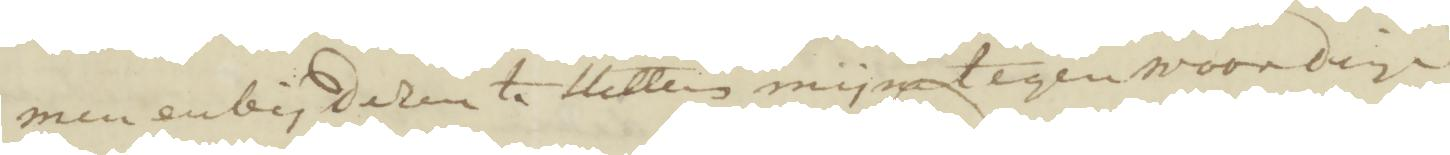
men en bij dezen te stellen mijn tegenwoordige
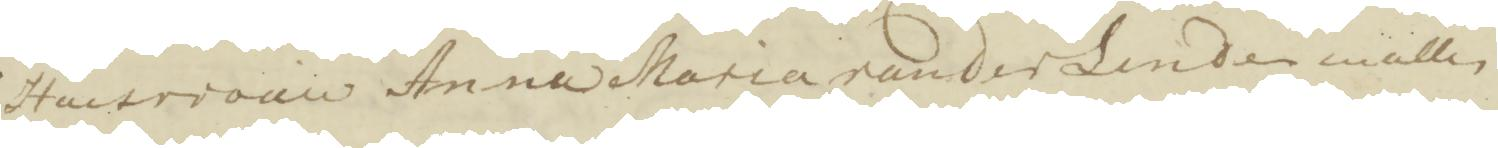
Huisvrouw Anna Maria van der Linden in alles
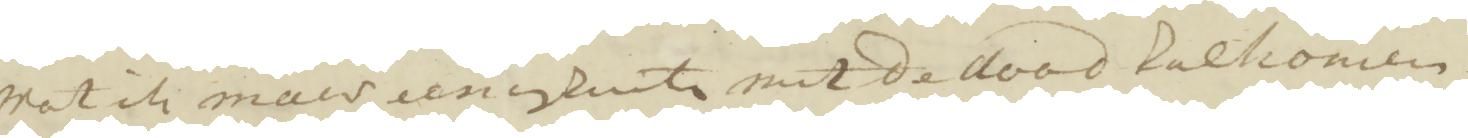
wat ik maer eenigzints met de dood zalkomen
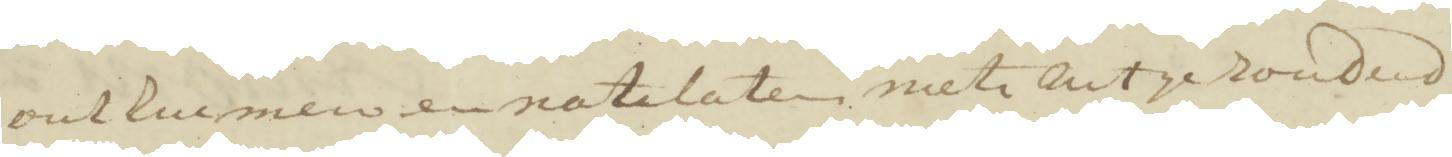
ontruimen en natelaten niets uitgezonderd
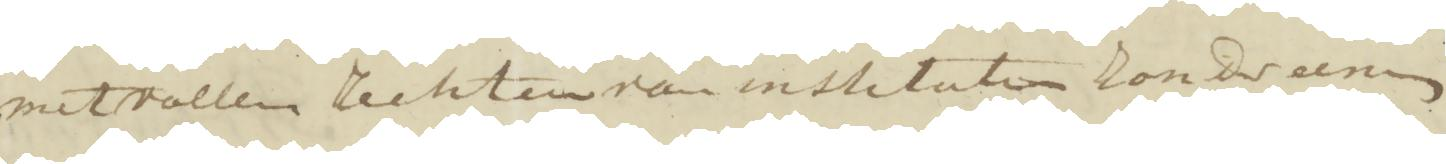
met vollen rechten van instituten zonder een
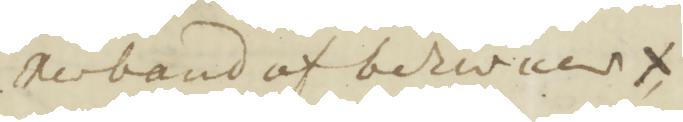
verband of bezwaer X
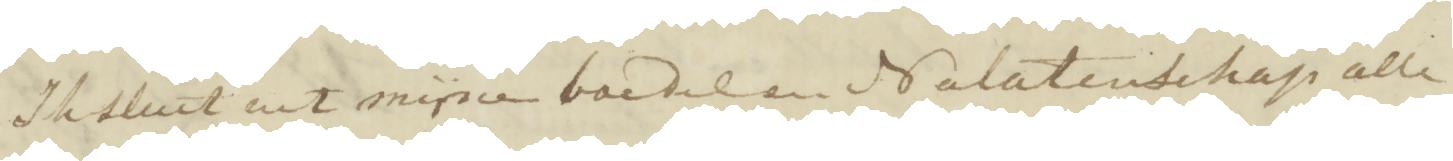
Iksluit uit mijnen boedel en Nalatenschap alle
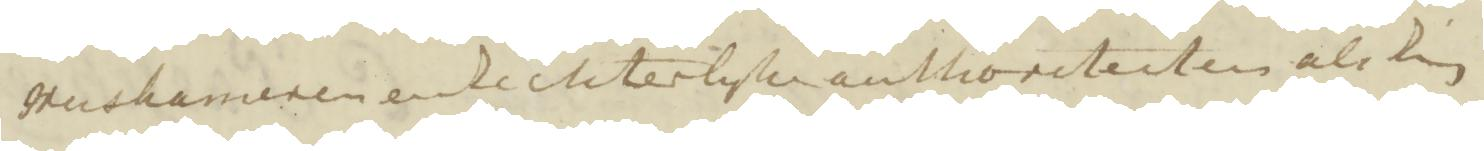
weeskameren en rechterlyke authoriteiten als zy
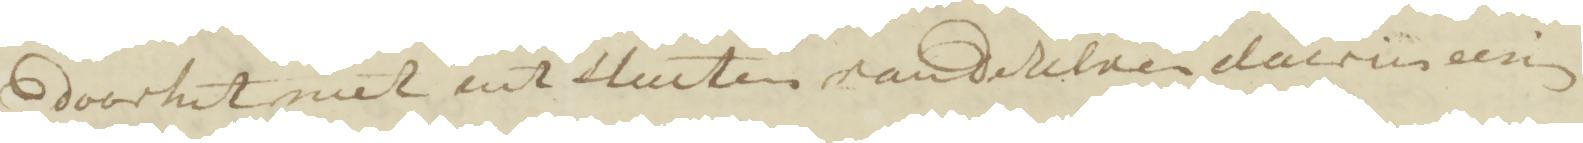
door het niet uitsluiten vandezelven daerin een
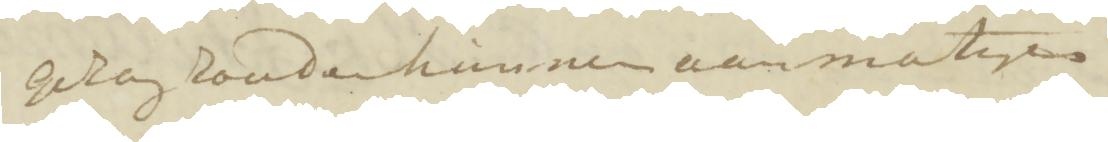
gezag zouden kunnen aan matigen
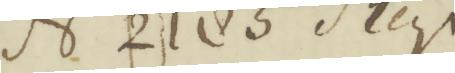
N2185 Reg
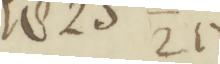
1825 3/25
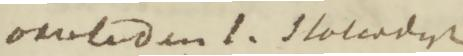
overleden te Sloterdyk
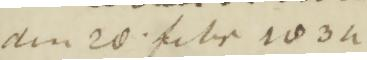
den 28 febr 1834
